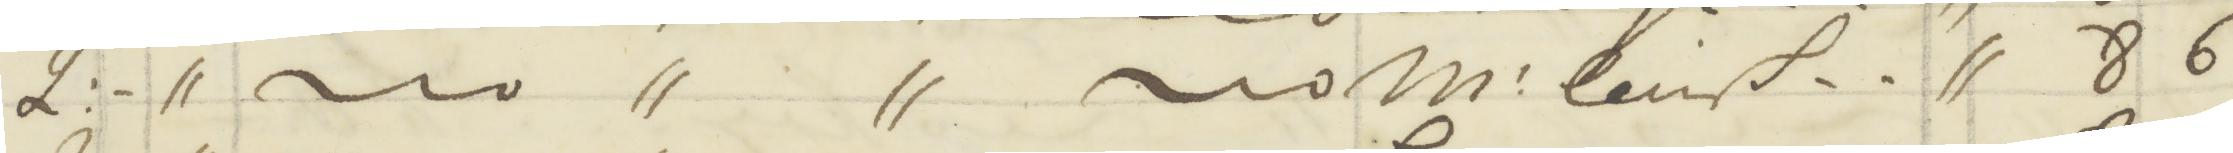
2:- „ _o „ „ _o M: leurs . . „ 8 6
